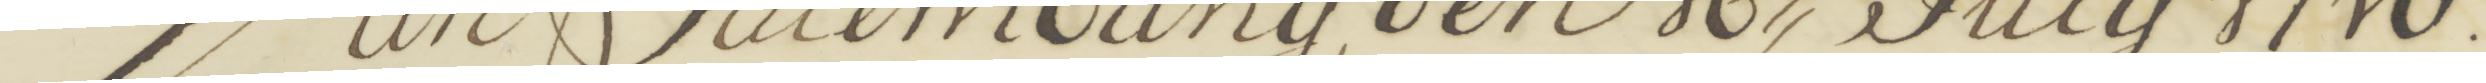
Van Palembang, den 18„e Iulij 1710:
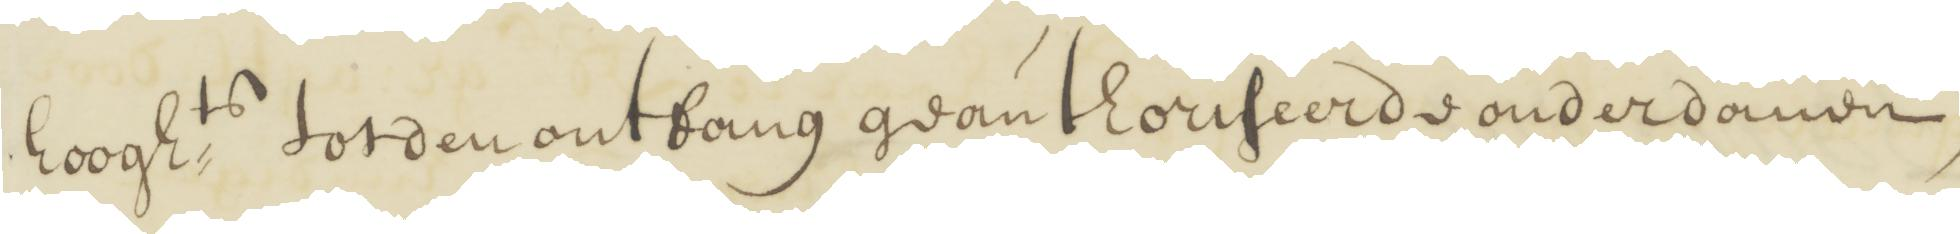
hoogh„ts totden ontfang geauthoriseerde onderdanen,
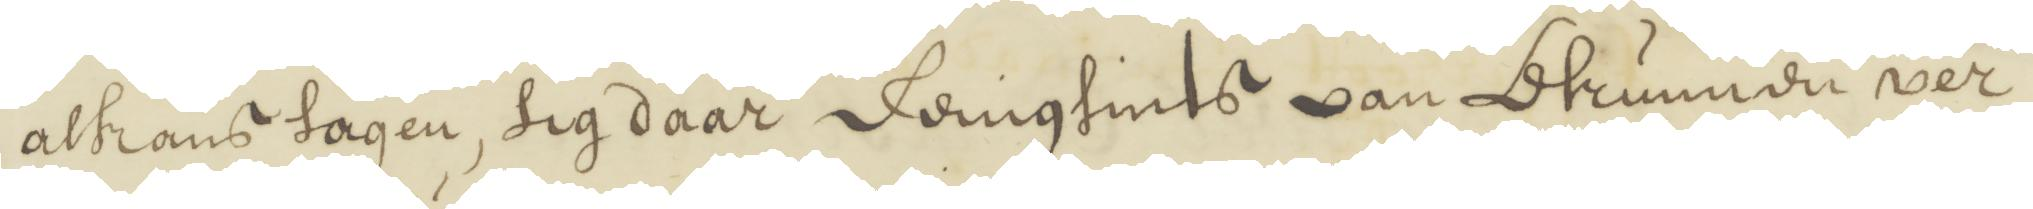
alkans sagen, sig daar Eenigsints van tekunnen ver
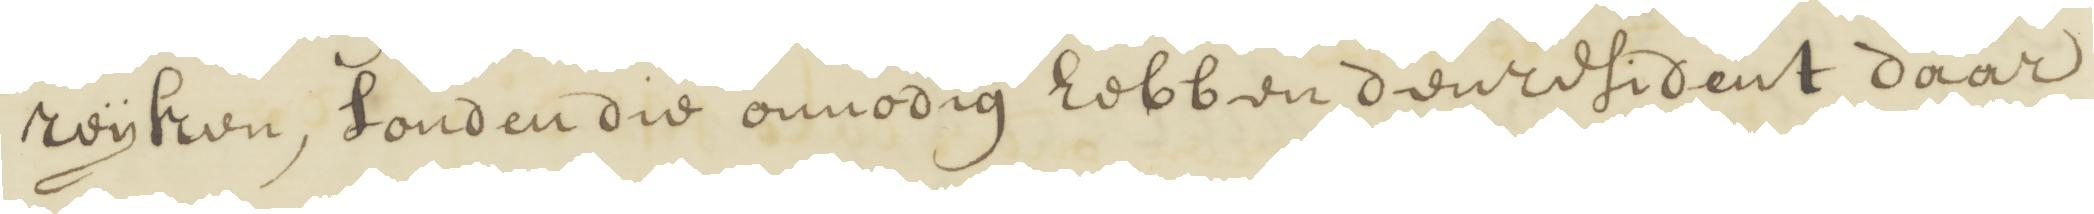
reijken, souden die onnodig hebben denresident daar
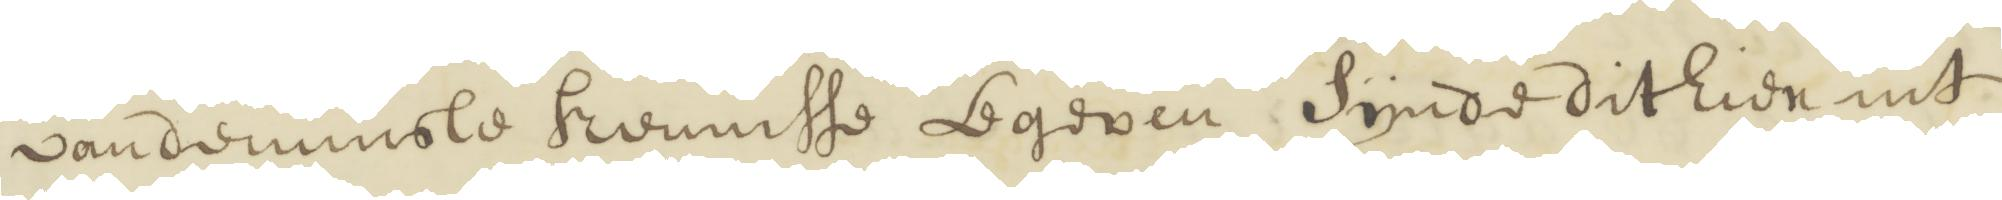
van deminste kennisse te geven sijnde dithier in't
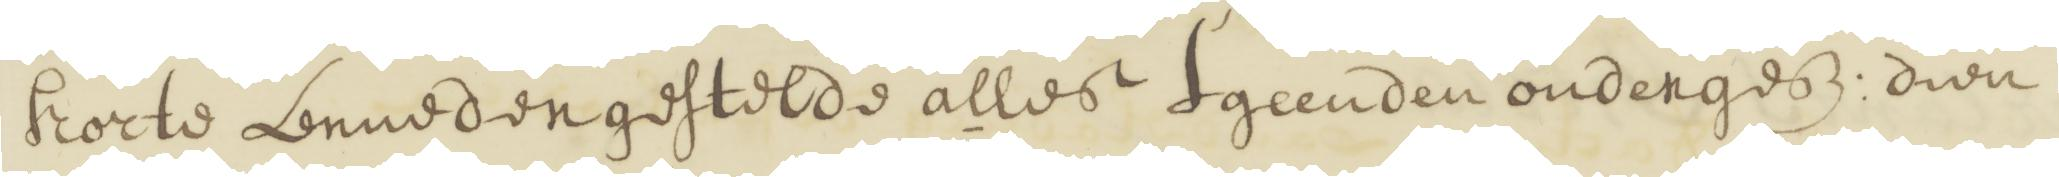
korte tenneder gestelde alles t' geen den ondergesz: dien
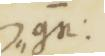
gr:
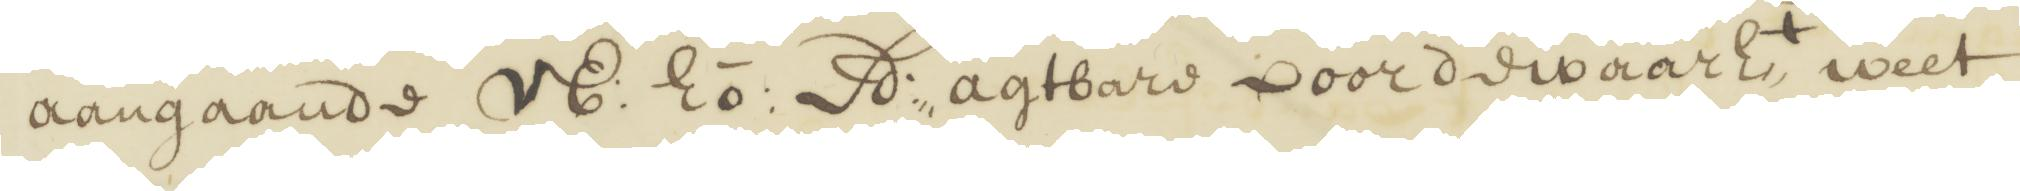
aangaande VE: ho: Ed:„ agtbare voor dewaarh„t weet
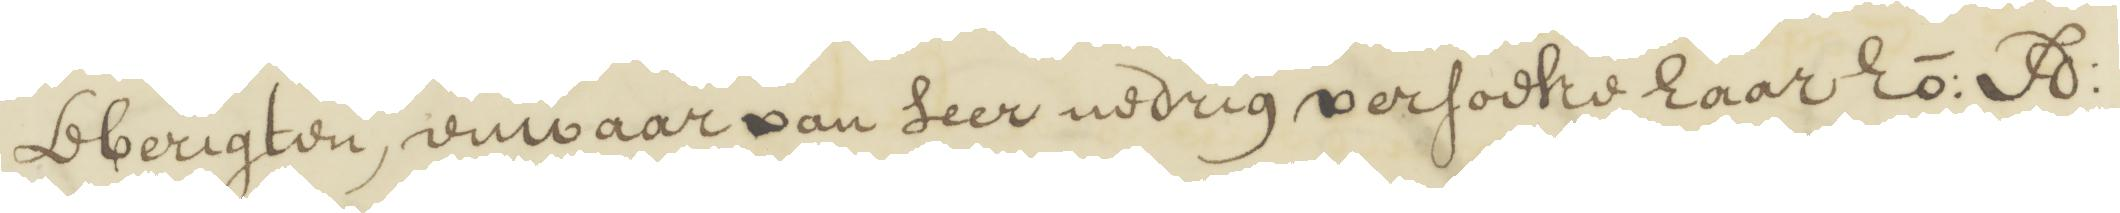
teberigten, enwaar van seer nedrig versoeke haar ho: Ed:
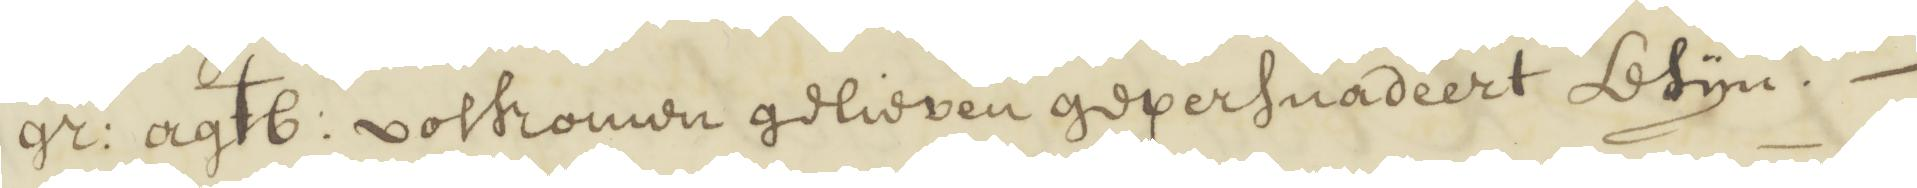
gr: agtb: volkomen gelieven gepersuadeert tesijn. —
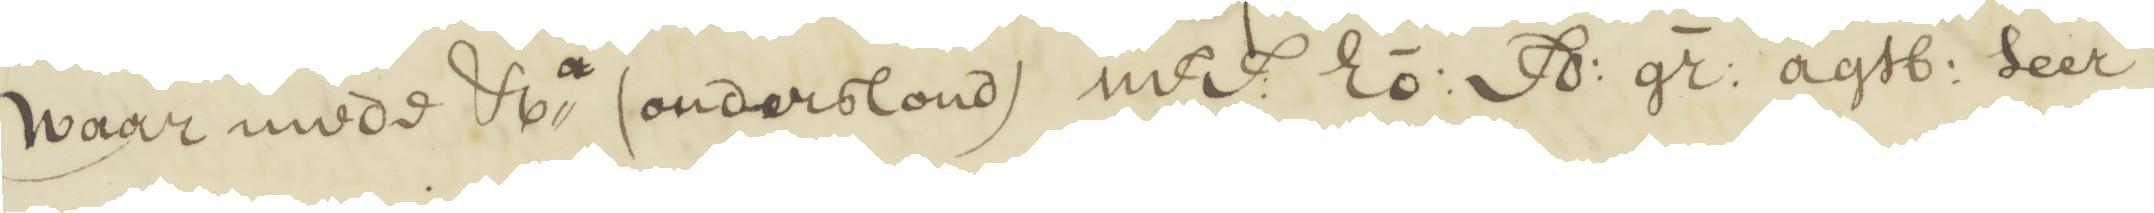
Waar mede Et„a (onderstond) uEE: ho: Ed: gr: agtb: seer
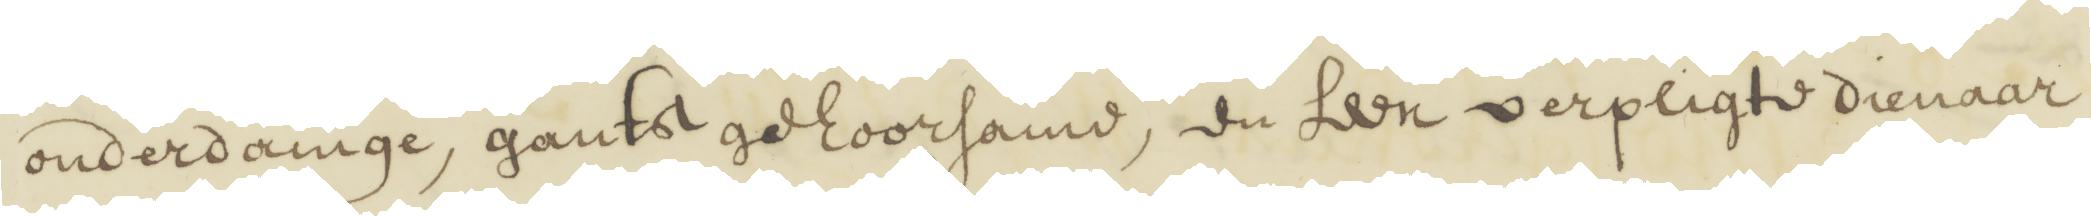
onderdanige, gants gehoorsame, en seer verpligte dienaar
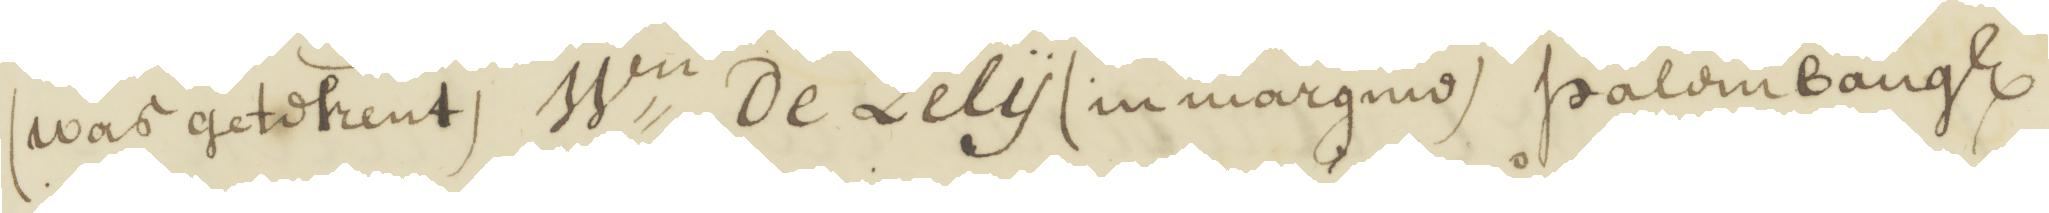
(was getekent) W„n de Lelij (in margine) palembangh
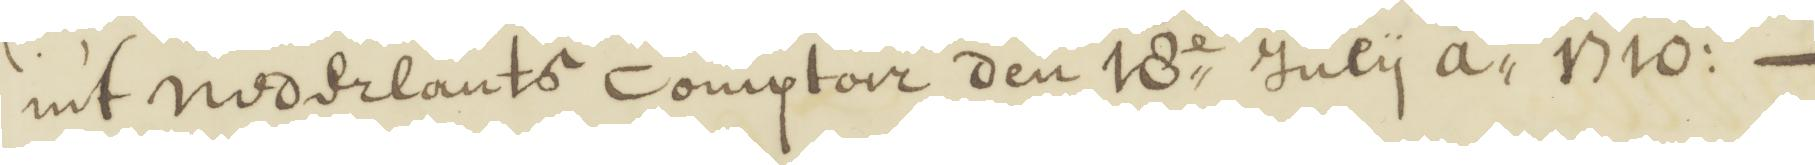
in’t nederlants Comptoir den 18„e Iulij A„o 1710: —
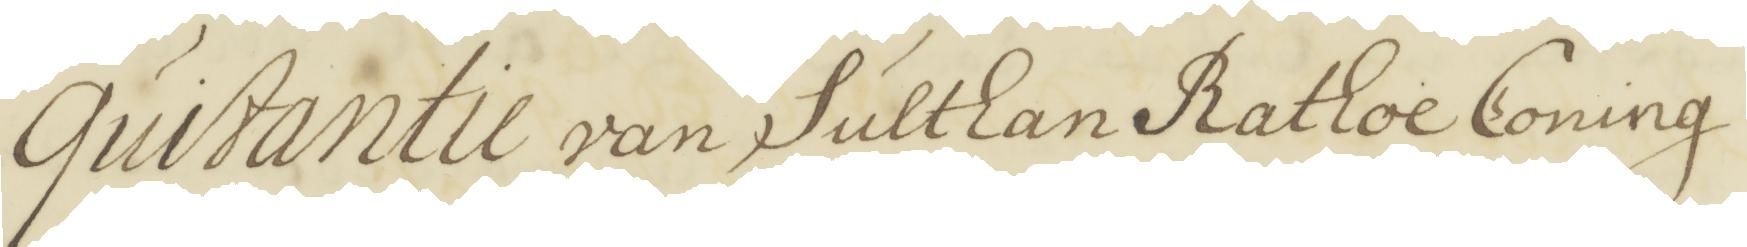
Quitantie van Sulthan Rathoe Coning
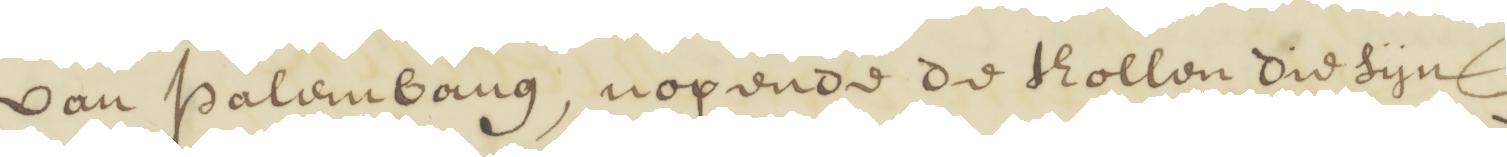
van Palembang, nopende de thollen die sijn
